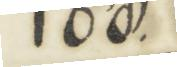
168.
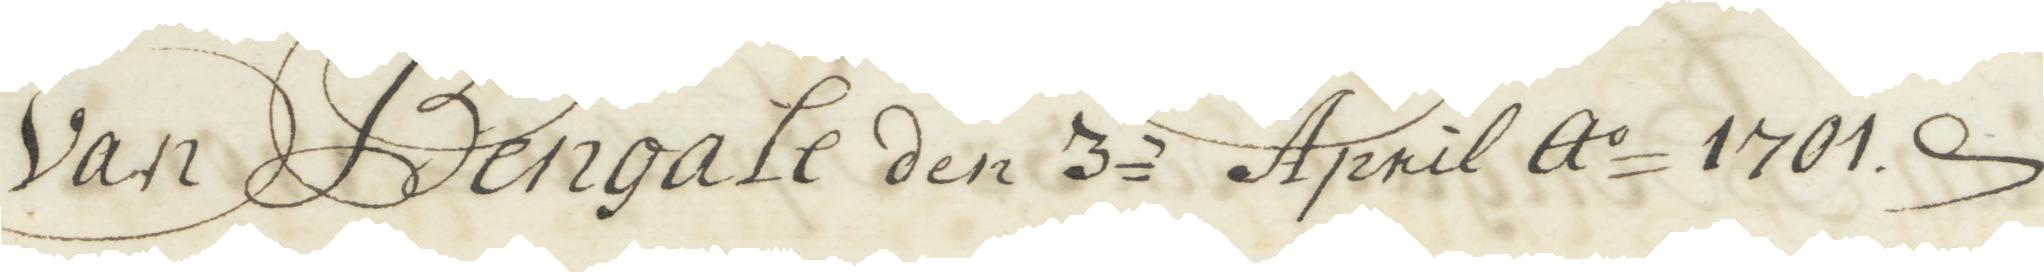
Van Bengale den 3=' April A=o 1701.—
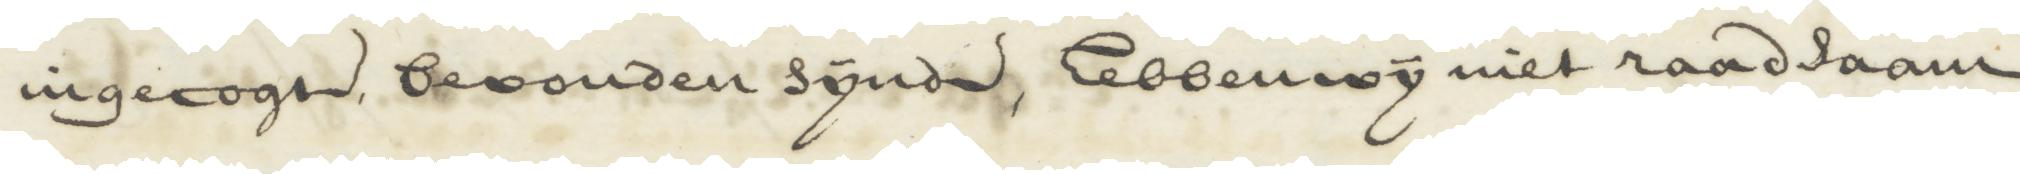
ingecogte, bevonden sijnde, hebben wij niet raadsaam
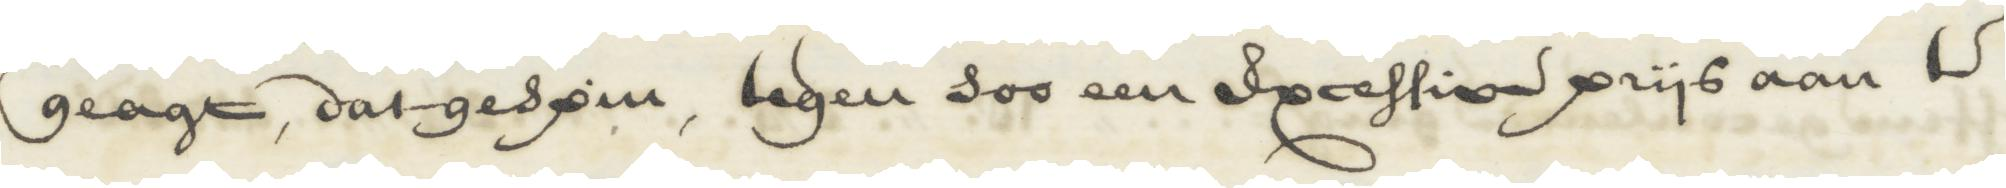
geagt, dat gespin, tegen soo een excessive prijs aan te
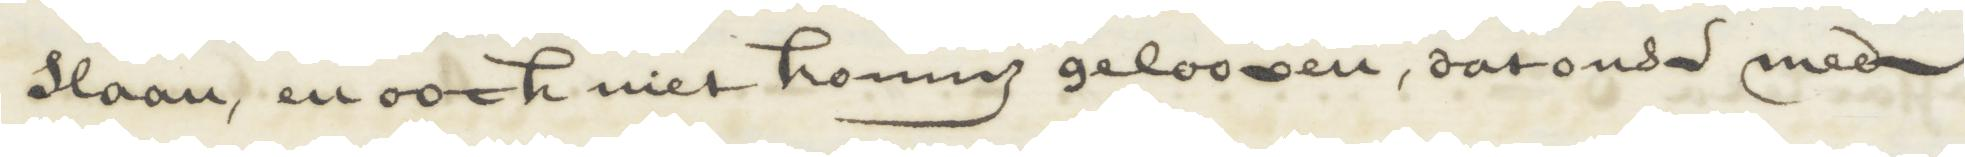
slaan, en oock niet konnen gelooven, dat onse mede
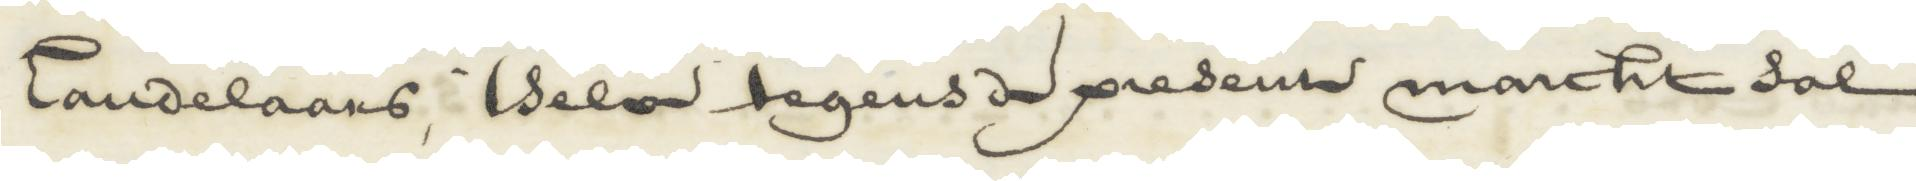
handelaars, 'tselve tegens de presente marckt sal
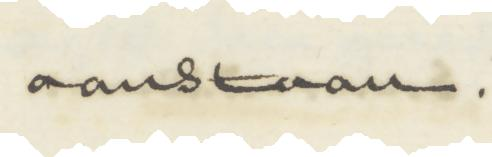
aanstaan.
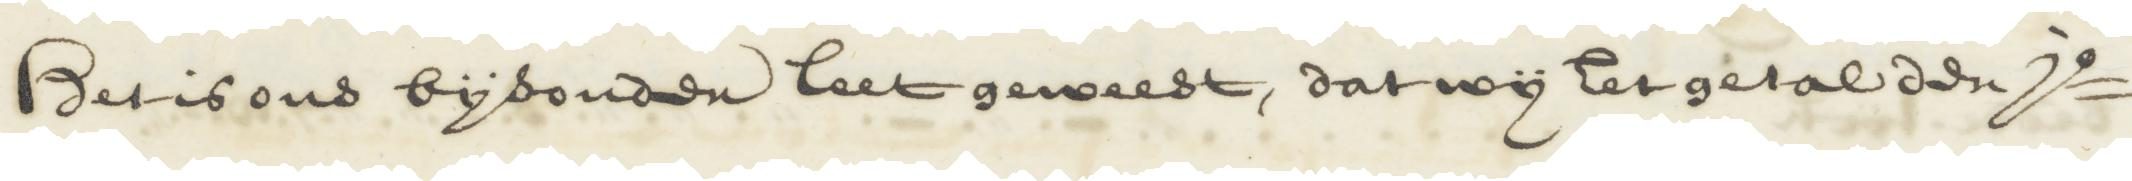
Het is ons bijsonder leet geweest, dat wij het getal den j=o
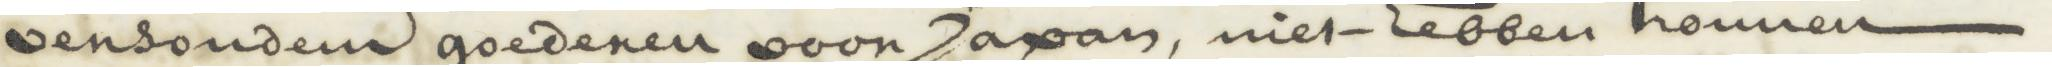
versondene goederen voor japan, niet hebben konnen
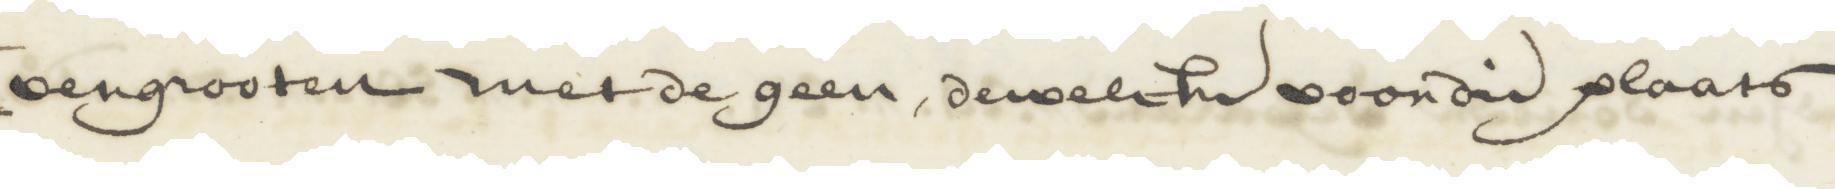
vergrooten met de geen, dewelcke voor die plaats
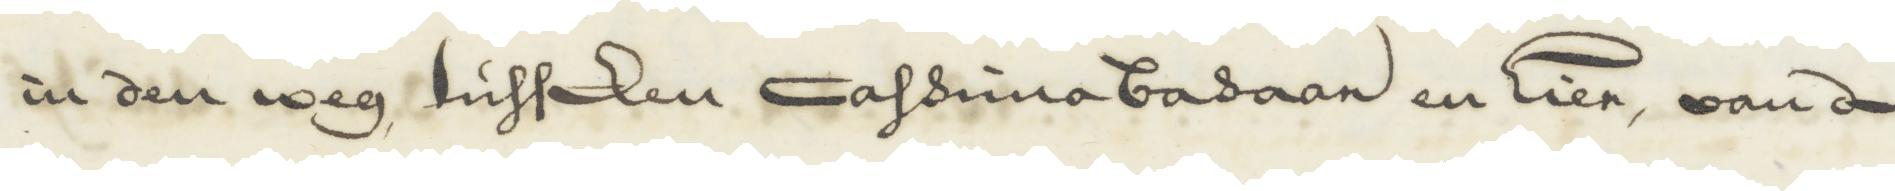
in den weg tusschen cassunabasaar en hier, van de
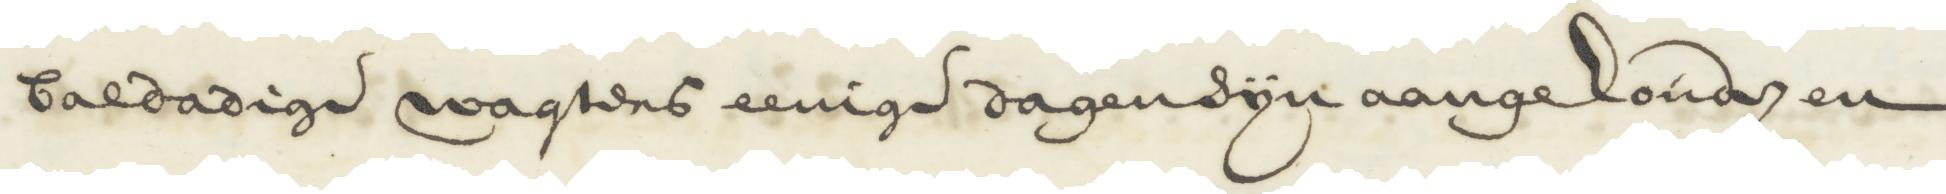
baldadige wagters eenige dagen sijn aangehouden en
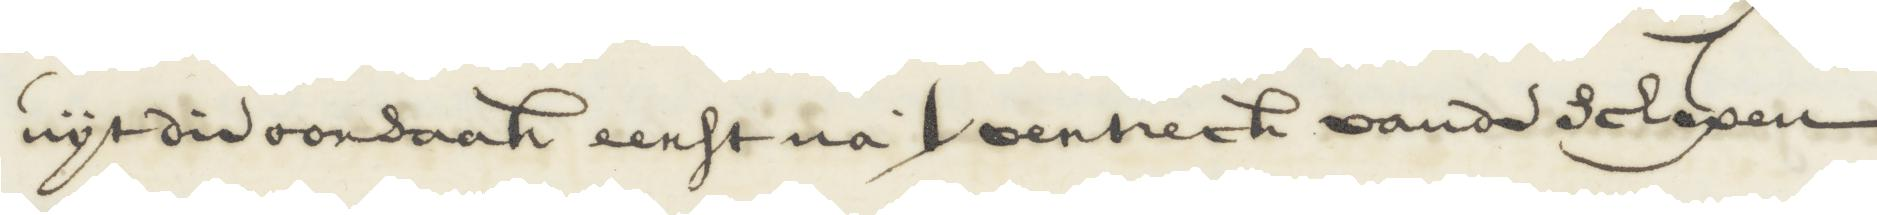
uijt die oorsaak eerst na 't vertreck van de schepen
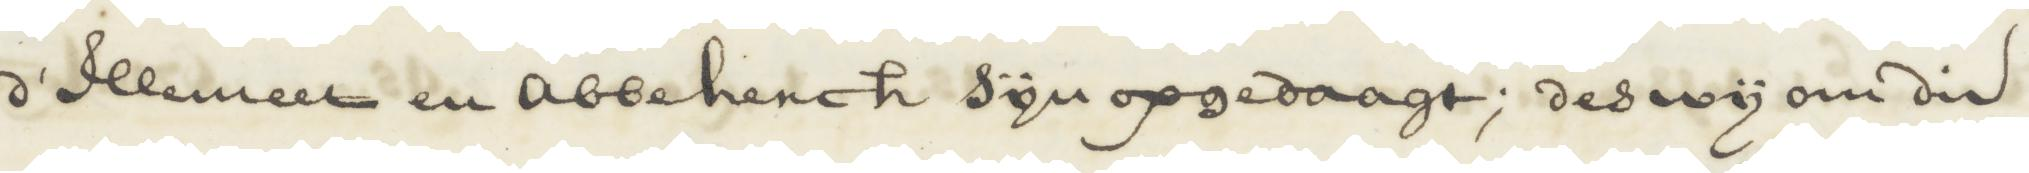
d’ Ellemeet en Abbekerck sijn opgedaagt; des wij om die
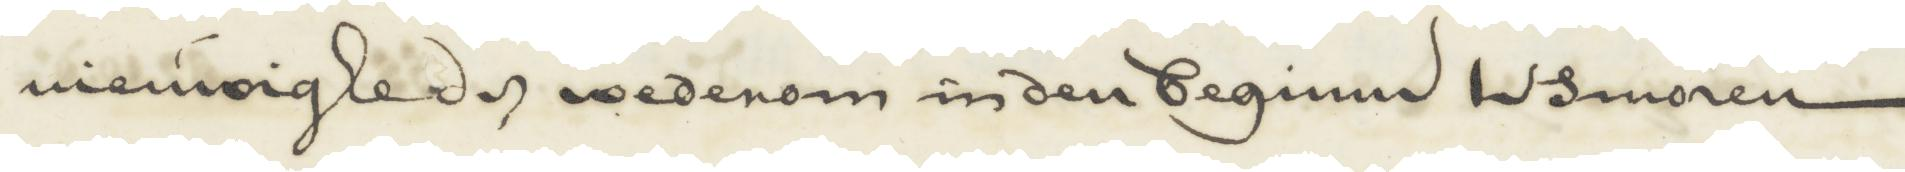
nieuwigheden wederom in den beginne te smoren,
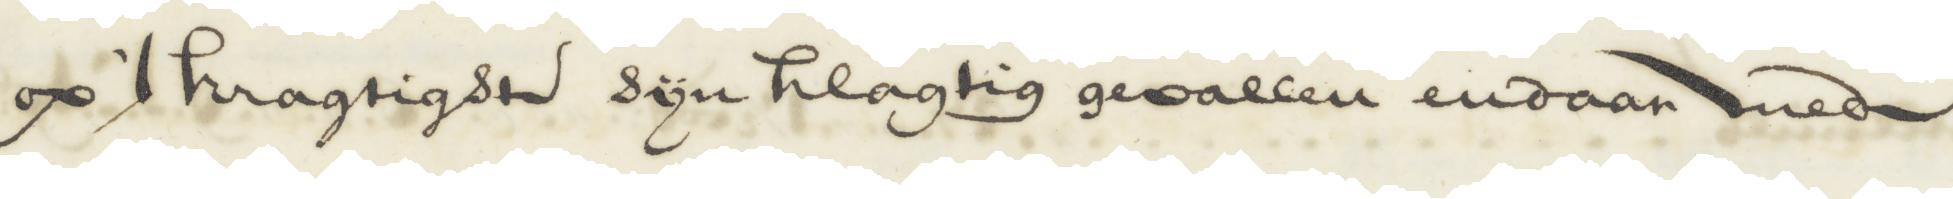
op ’t kragtigste sijn klagtig gevallen en daar mede
